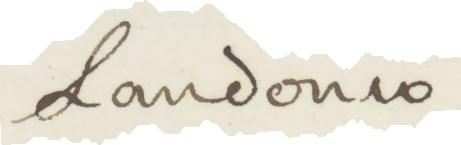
Landouw
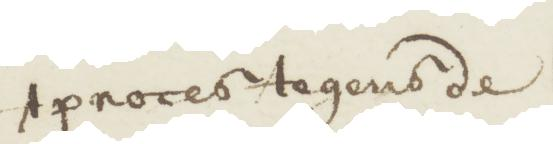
t proces tegens de
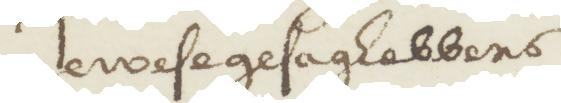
gewese gesaghebbers
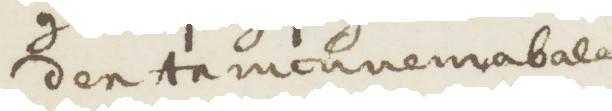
der trincknemabale
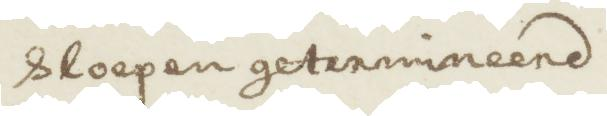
sloepen getermineerd
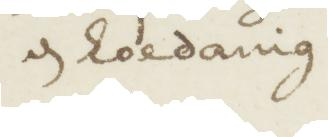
en hoedanig
